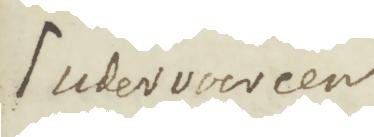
¶ Ieder voor een
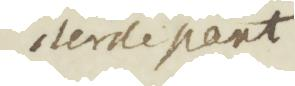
„derde part
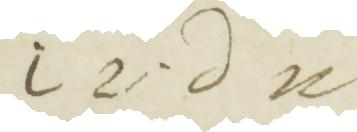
i u d n:
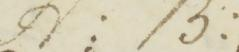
H:B:
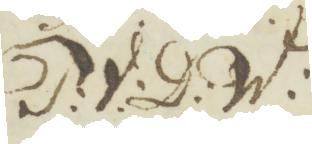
P: V: D:W:
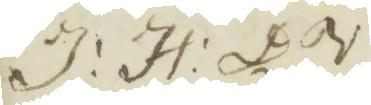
J: H: D V
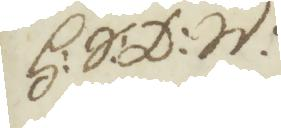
G: v: D:W:
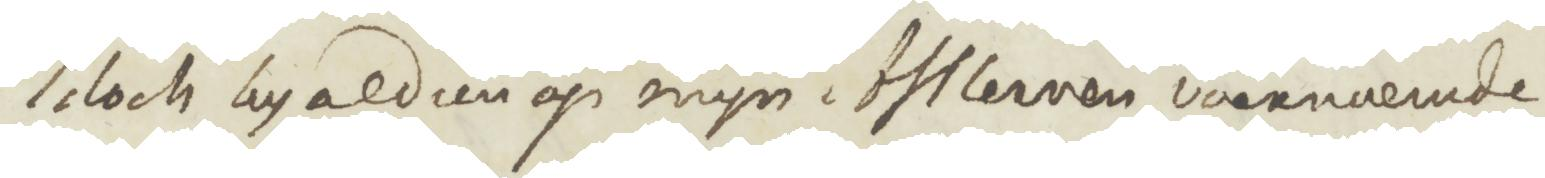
Edoch hy aldien op myn Afsterven voornoemde
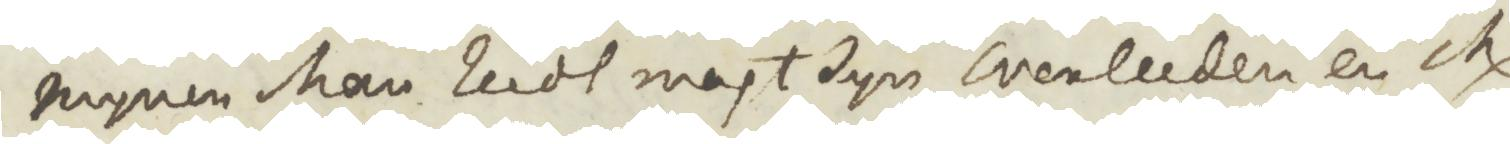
mynen man reeds mogt zyn overleeden en ik
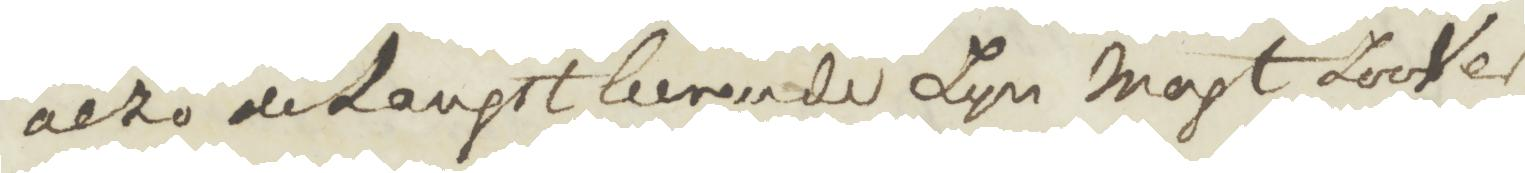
alzo de Langst leevende zyn mogt, zoo ver
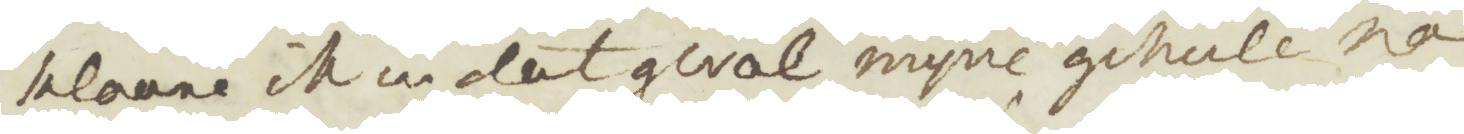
klaare ik in dat geval myne geheele na
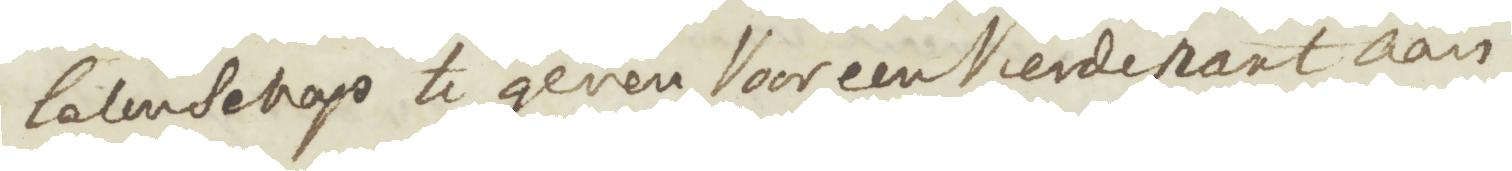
latenschap te geven Voor een Vierde part aan
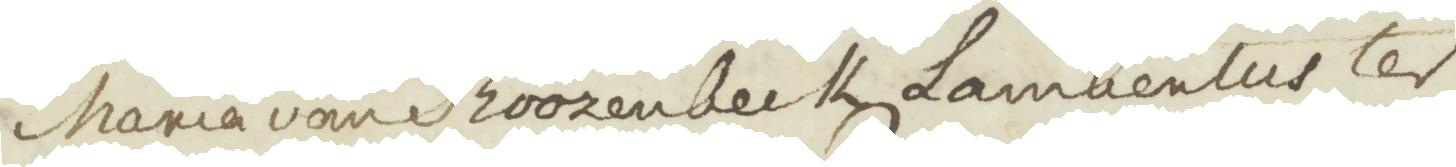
Maria van Roozenbeek Lambertus ter
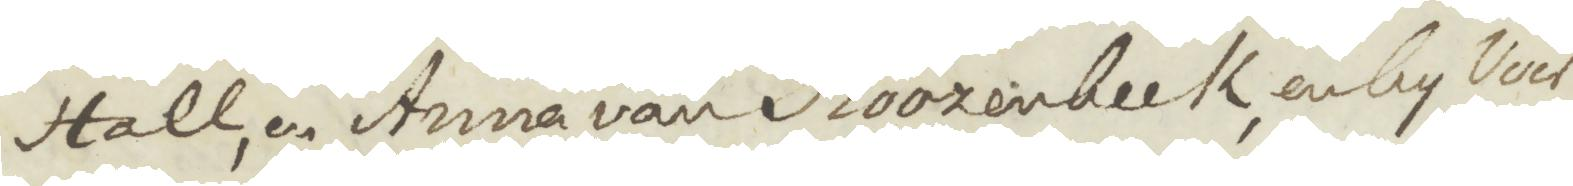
Hall, en Anna van Roozenbeek, en by Voor
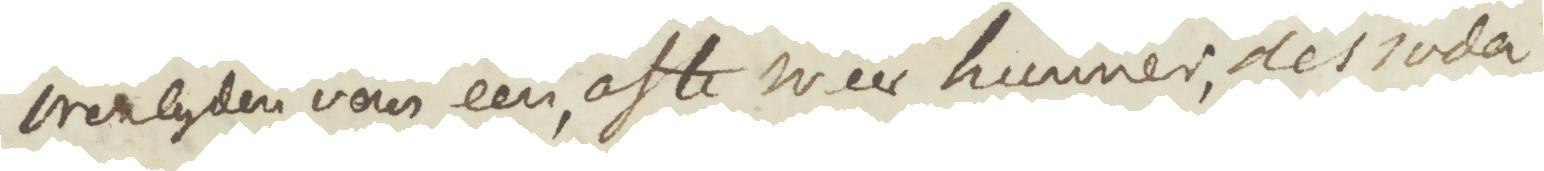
overlyden van een, ofte meer hunner, des zoda
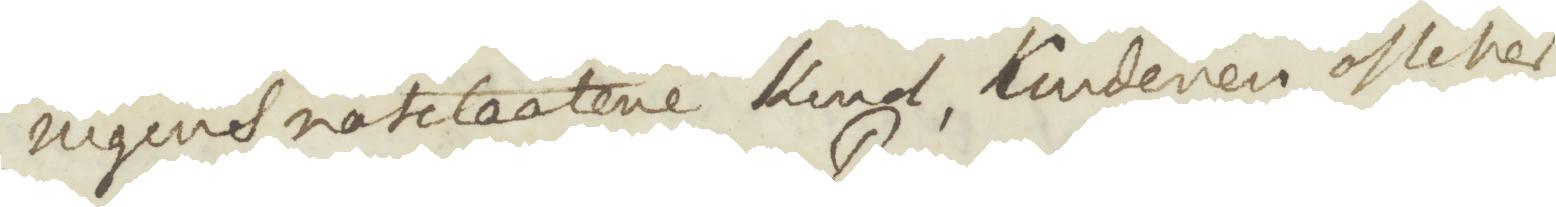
nigens natelaatene kind, kinderen of te ver
